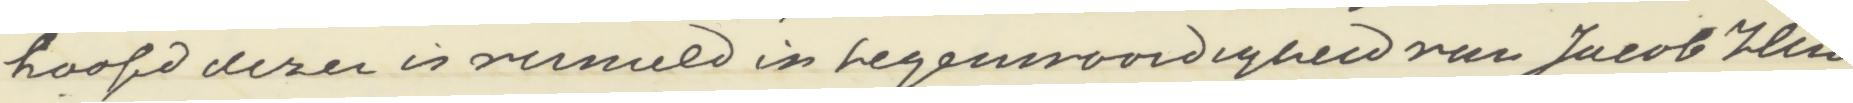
hoofd dezer is vermeld in tegenwoordigheid van Jacob Hen
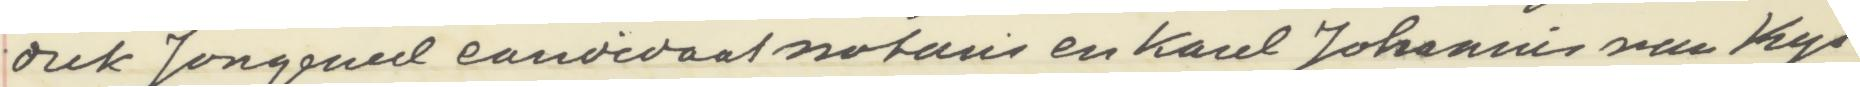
drik Jongeneel candidaat notaris en Karel Johannis van Rys
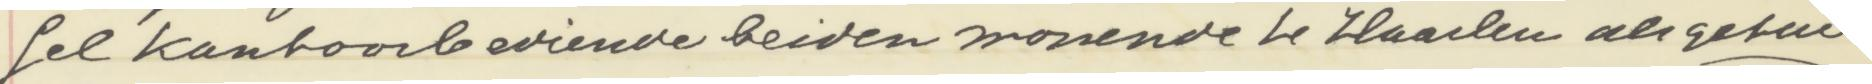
sel kantoorbediende beiden wonende te Haarlem als getui
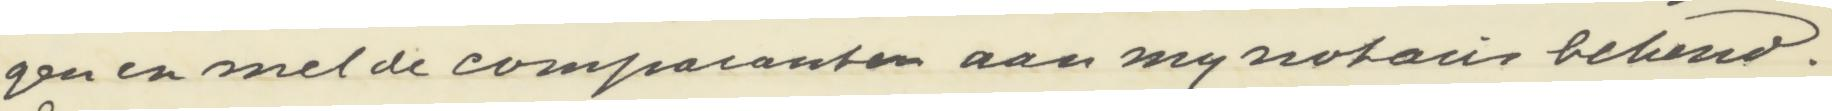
gen en met de comparanten aan my notaris bekend.
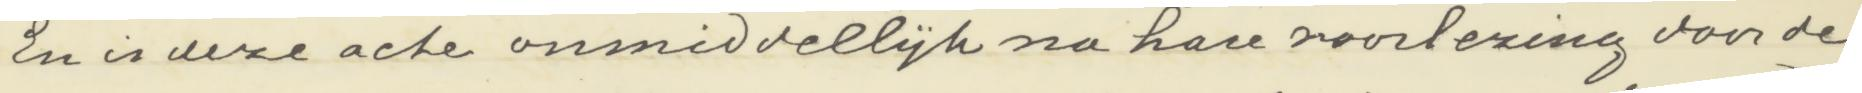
En is deze acte onmiddellijk na hare voorlezing voor de
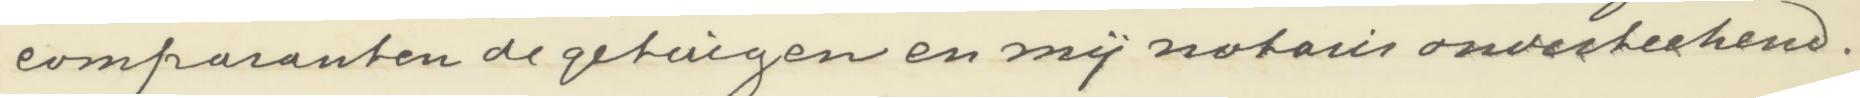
comparanten de getuigen en mij notaris onderteekend.
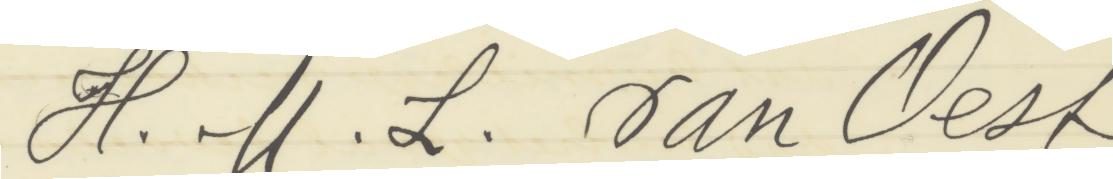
H. A. L. van Oest
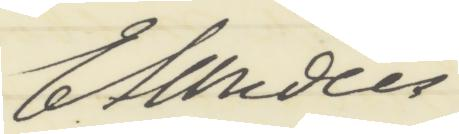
Esanders
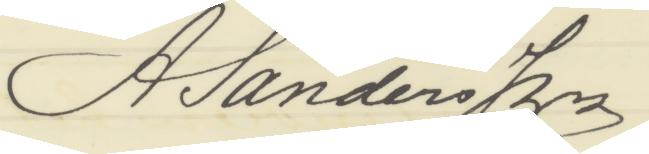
A Sanders Jr
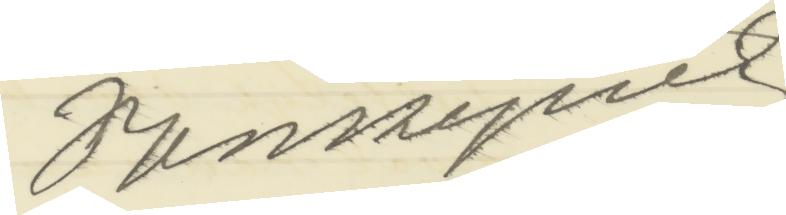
Vanryssel
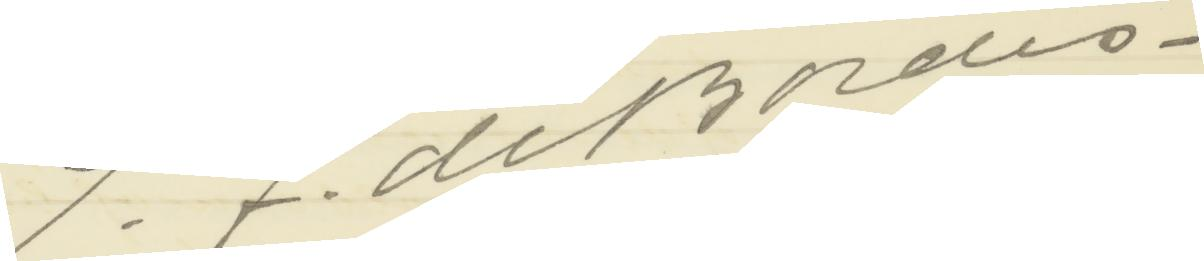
P.f. de Bordes -
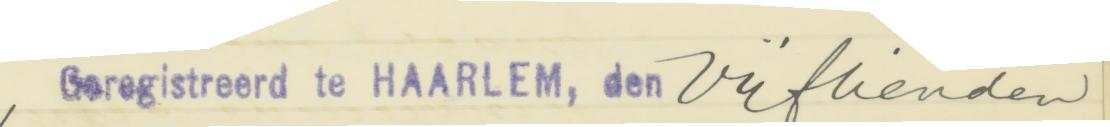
vijftienden
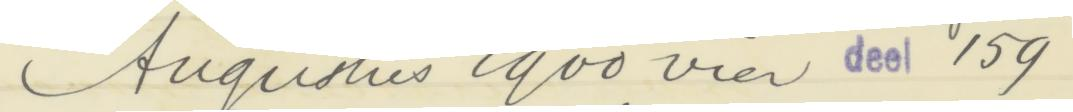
Augustus 1900 vier
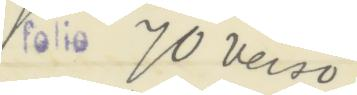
70 verso
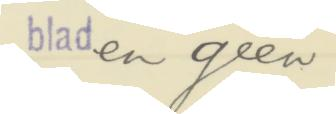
en geen
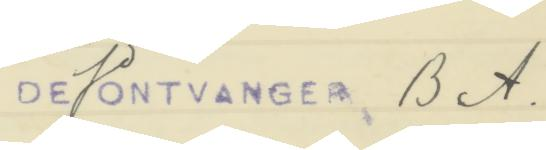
De Curvangen B A.
